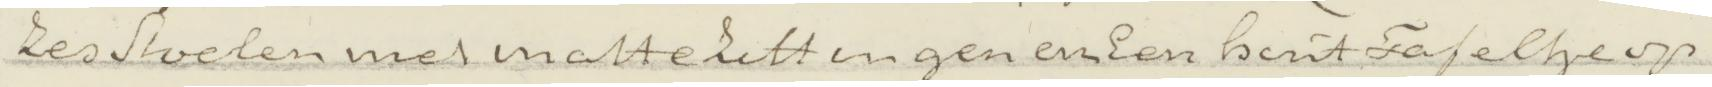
zes stoelen met matte zittingen en Een hout Tafeltje op
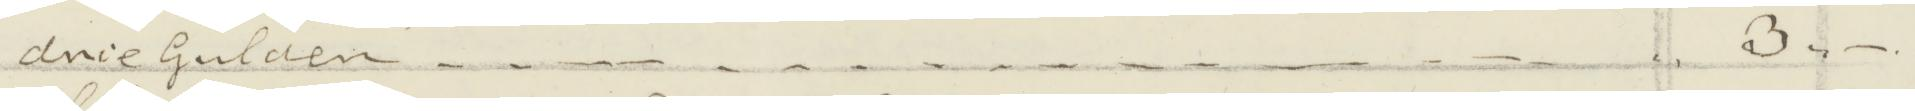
drie Gulden - - - - - - - - - - - - - - - - - „ 3 „ —.
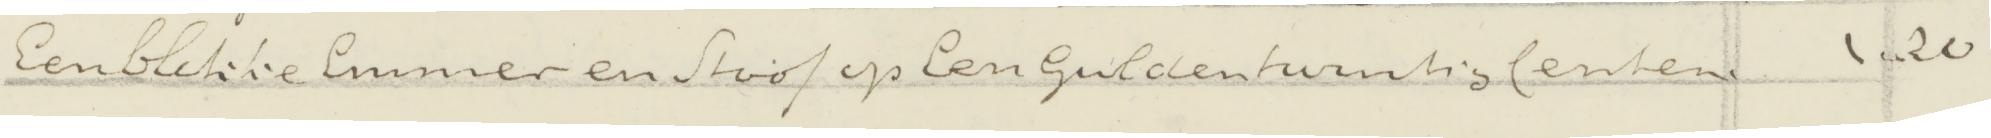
Een blikke Emmer en stoof op Een gulden twintig Centen„ 1„20
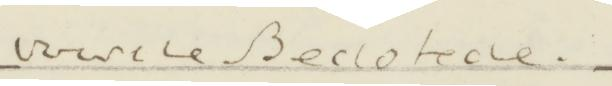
voor de Bedstede.
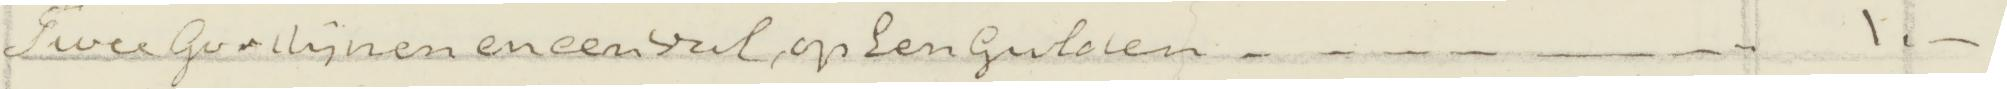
Twee Gordijnen en een val, op Een Gulden - - - - - - - „1 „ —
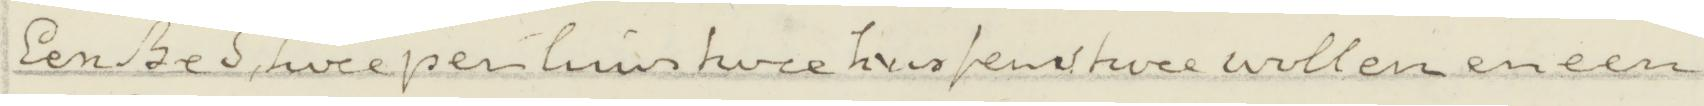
Een Bed, twee perluws twee kussens twee wollen en een
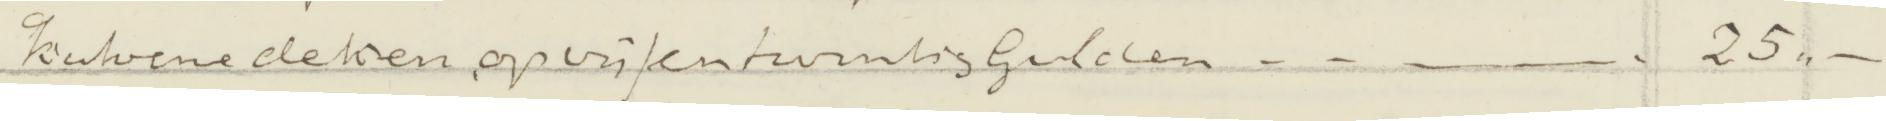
katoene deken, op vijfentwintig Gulden - - - - - , 25„ —
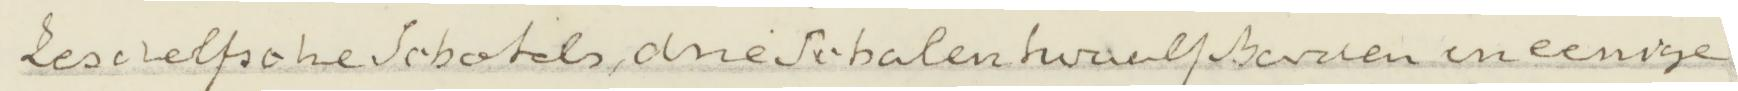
zes delfsche schotels, drie schalen twaalf Borden en eenige
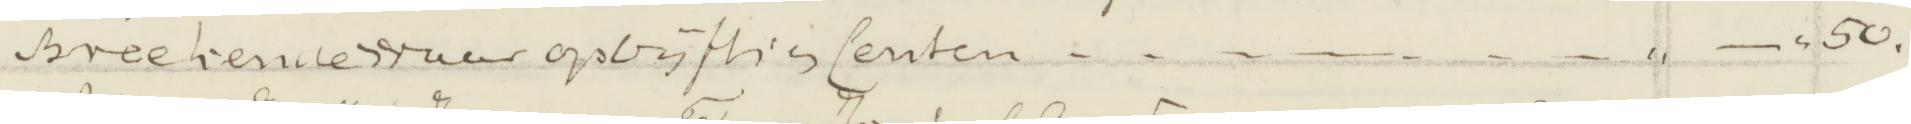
Breekende waar op vijftig Centen - - - - - - - „ — „ 50
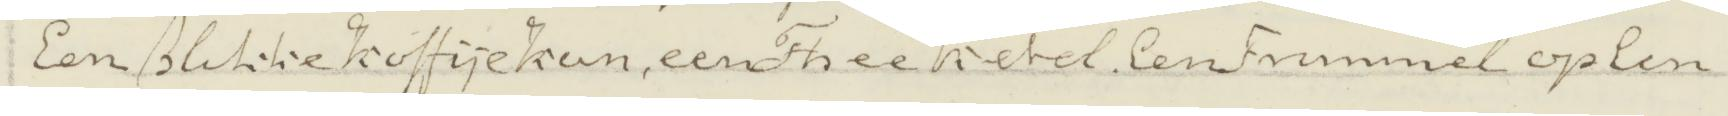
Een Blikke koffijekan, een Theeketel Een Trommel op Een
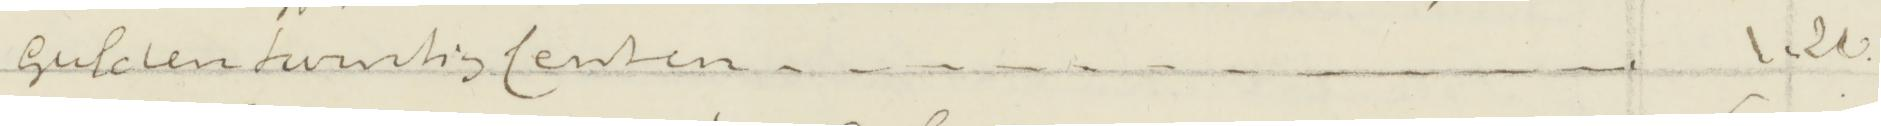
Gulden twintig Centen - - - - - - - - - - - „ 1„20
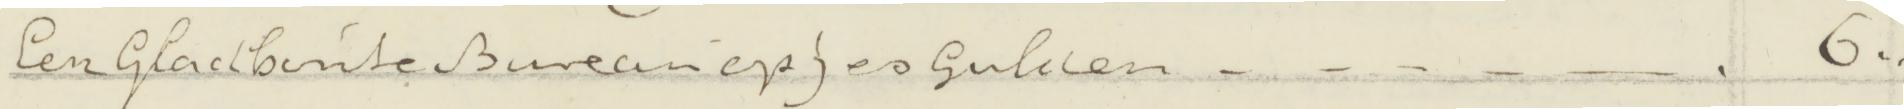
Een Gladhoute Bureau op Zes Gulden - - - - - - „ 6 „
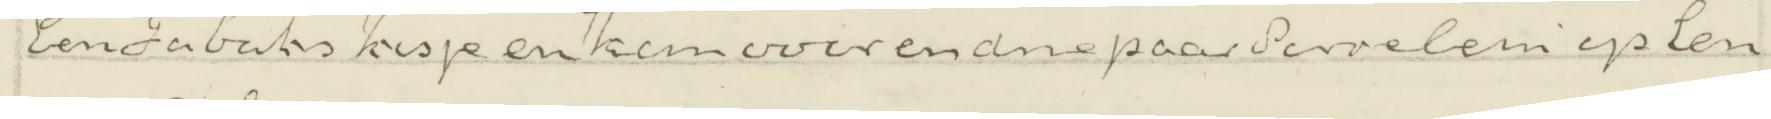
Een Tabaks kisje en kom voor en drie paar porcelein op Een
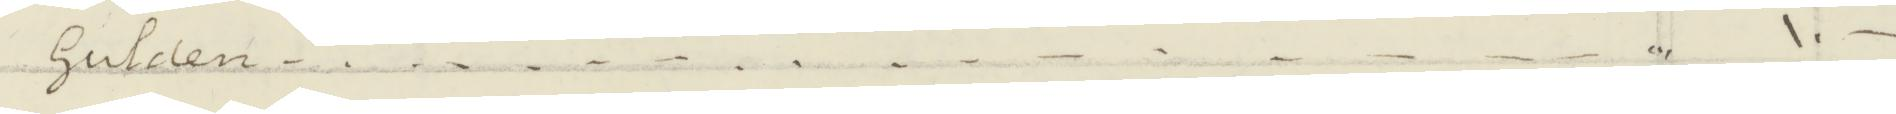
Gulden - . . - - - - . . - - - - - - - - „ 1. —
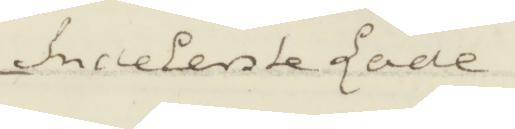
In de Eerste Lade
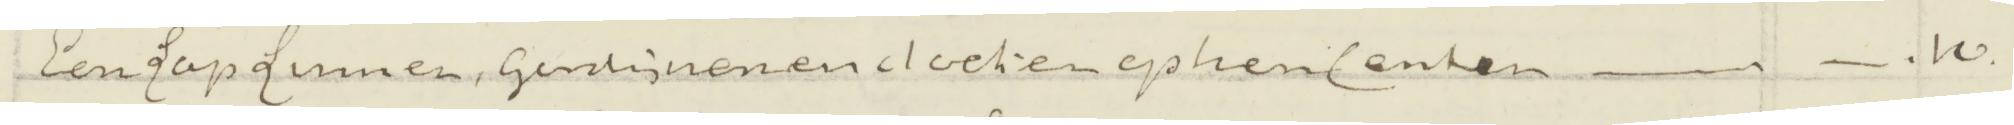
Een Lap Linnen, Gordijnen en doeken op tien Centen - - „ — . 10.
